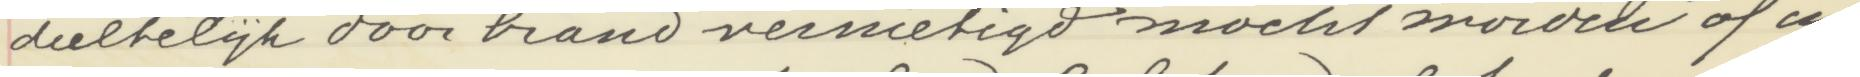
deeltelijk door brand vernietigd mocht worden of in
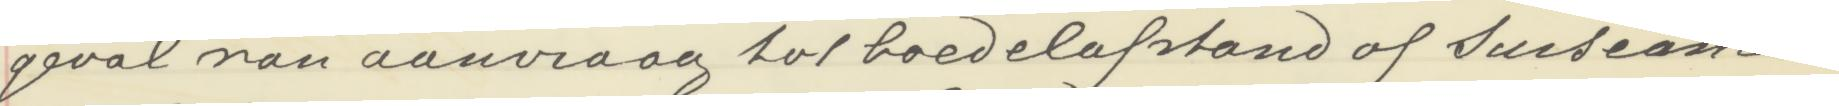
geval van aanvraag tot boedelafstand of surseance
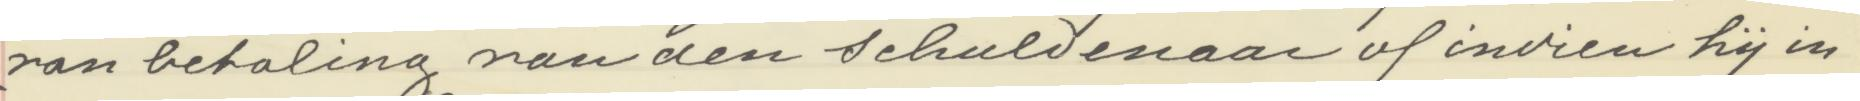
van betaling van den schuldenaar of indien hij in
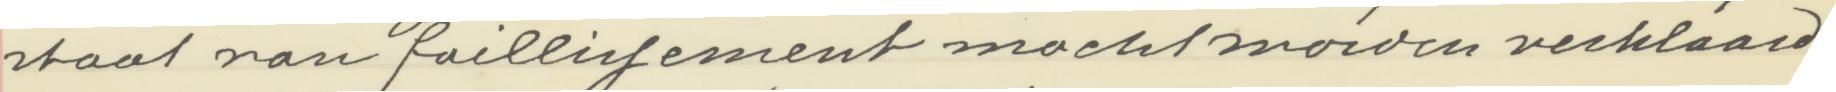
staat van faillissement mocht worden verklaard
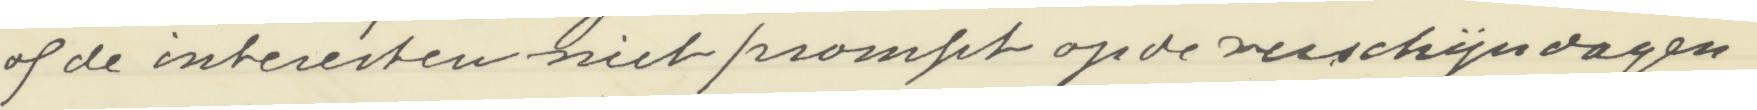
of de interesten niet prompt op de verschijndagen
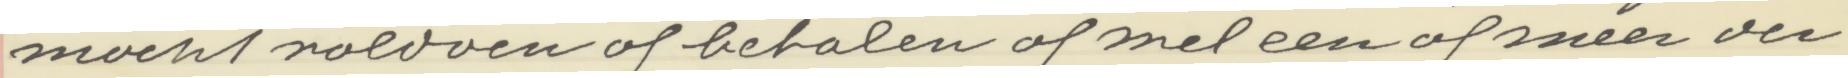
mocht voldoen of betalen of wel een of meer der
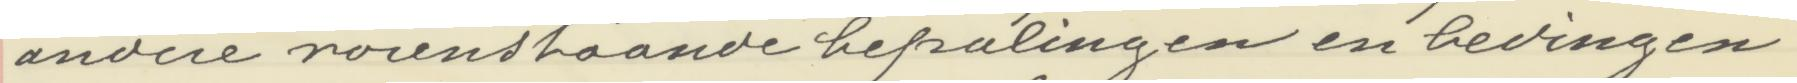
andere vorenstaande bepalingen en bedingen
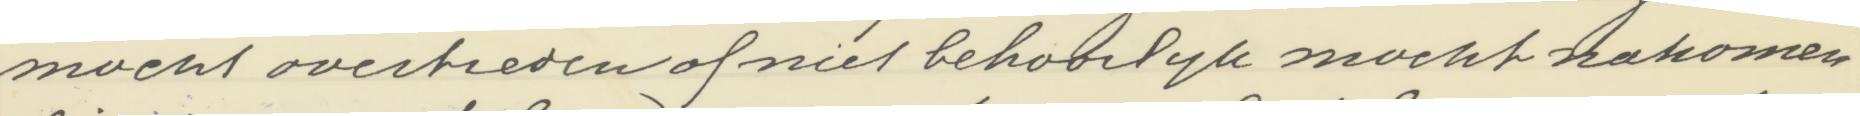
mocht overtreden of niet behoorlyk mocht nakomen
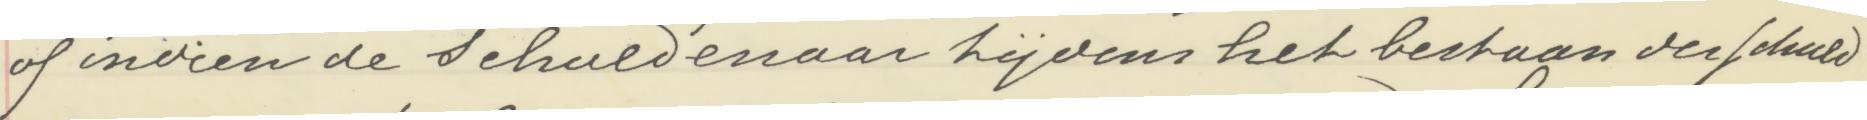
of indien de schuldenaar tijdens het bestaan der schuld
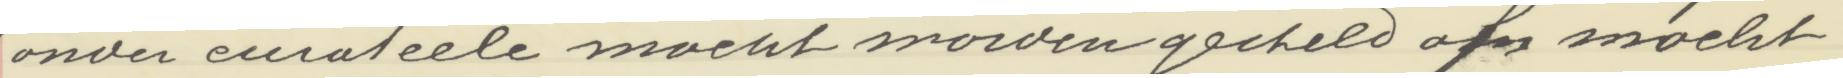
onder curateele mocht worden gesteld of mocht
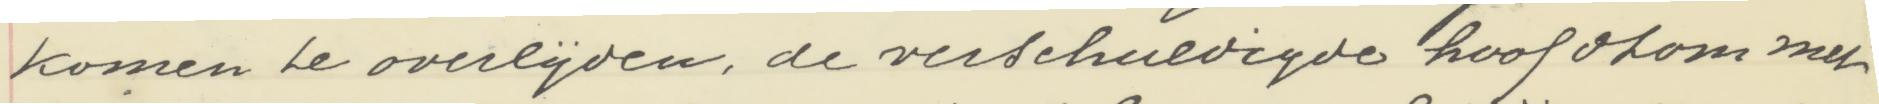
komen te overlijden, de verschuldigde hoofdsom met
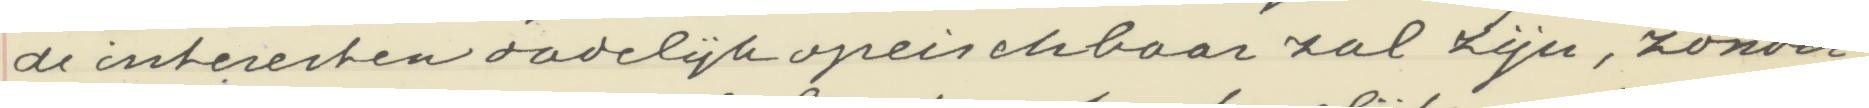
de interesten dadelijk opeischbaar zal zijn, zonder
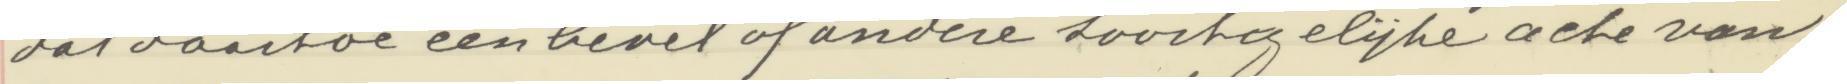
dat daartoe een bevel of andere soortgelijke acte van
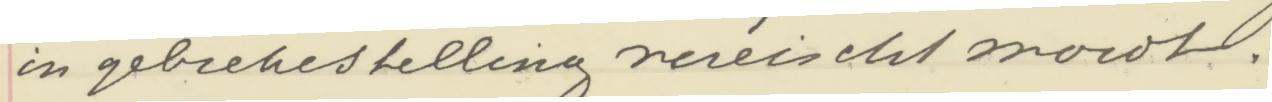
in gebrekestelling vereischt wordt.
